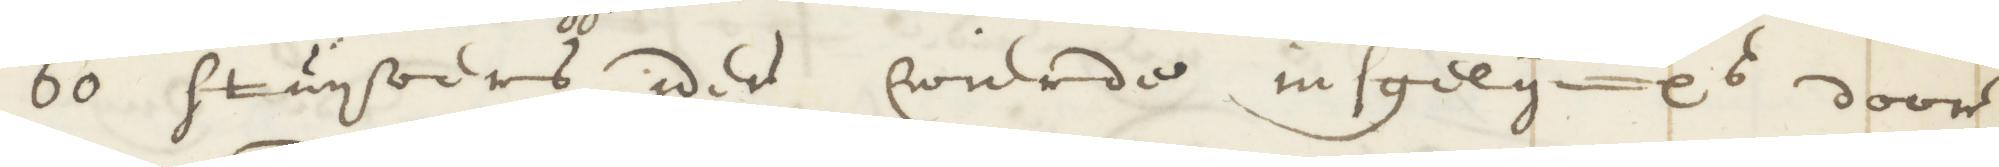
60 stuijvers ider wierde insgelijcks door
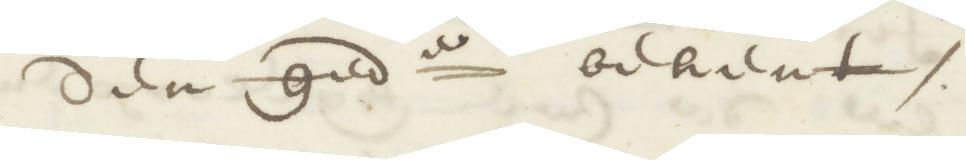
den ged=e bekent/.
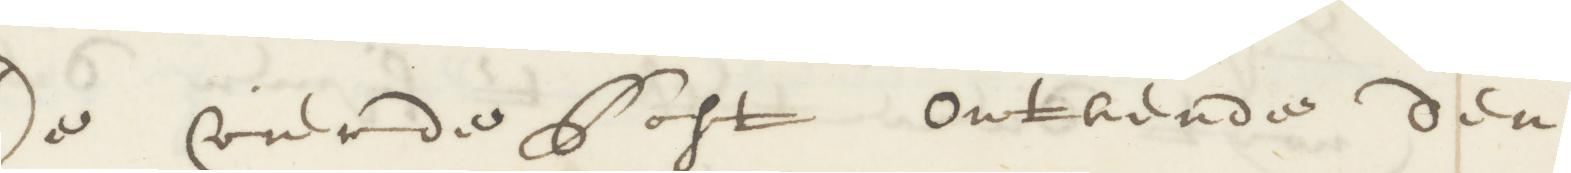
De vierde Post ontkende den
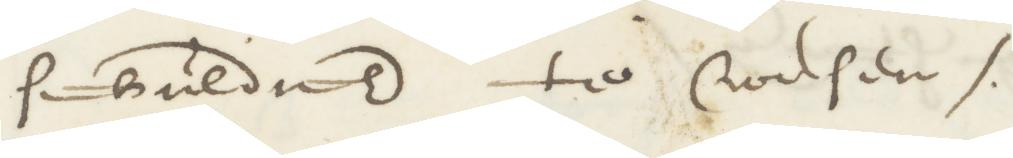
schuldich te wesen /.
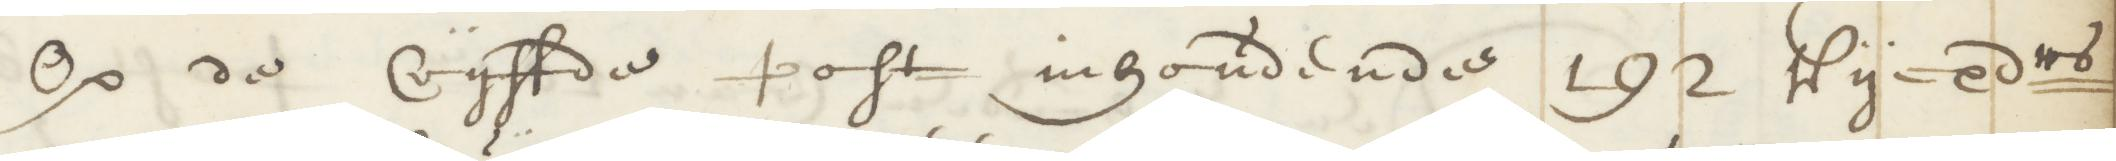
Op de vijffde post inhoudende 192 Rijcxd=rs
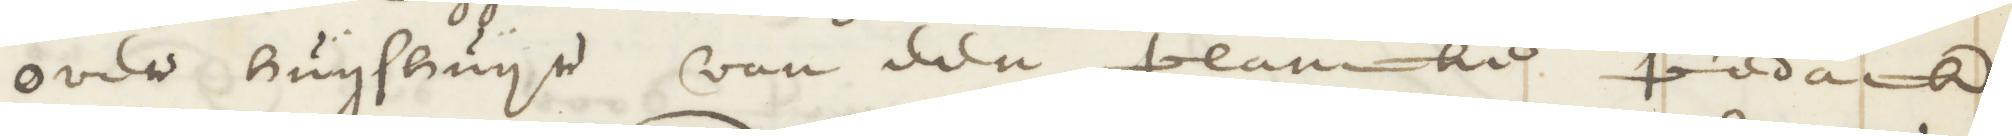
over huijshuijr van een plancke pedack
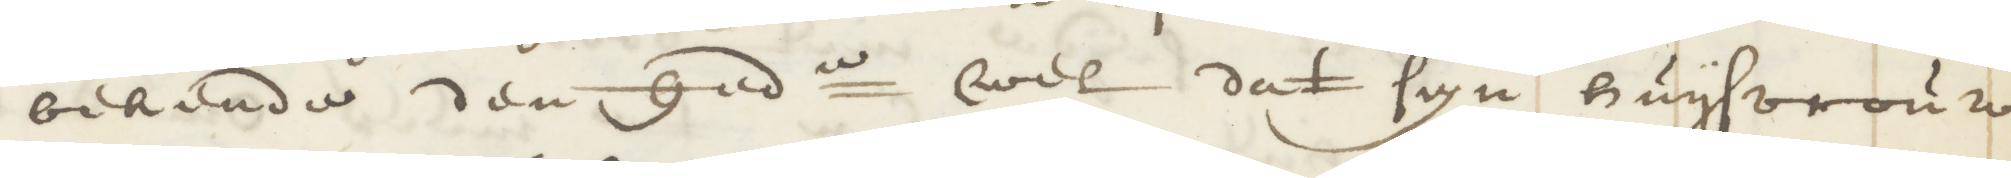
bekende den ged=e wel dat sijn huijsvrouw
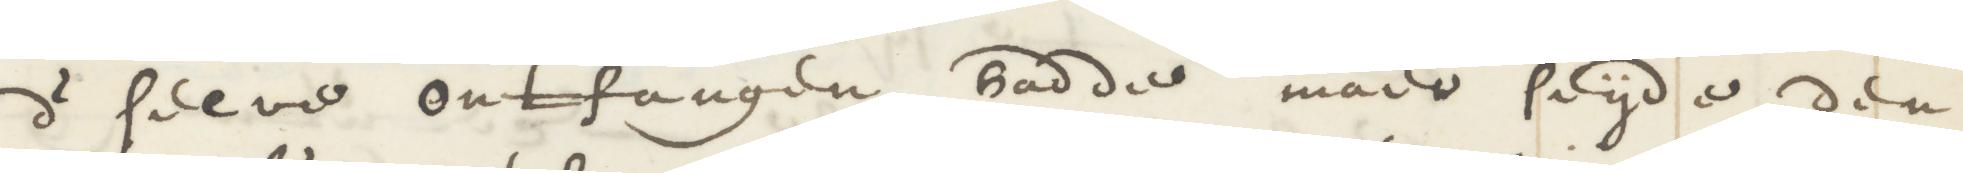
d’ selve ontfangen hadde maer seijde den
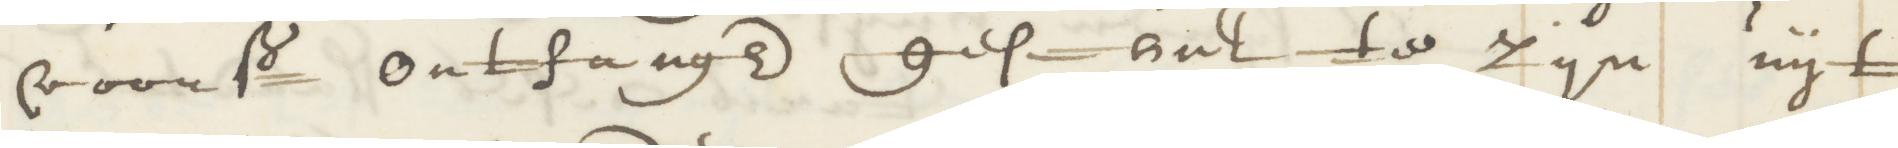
voors=z ontfangen geschiet te zijn uijt
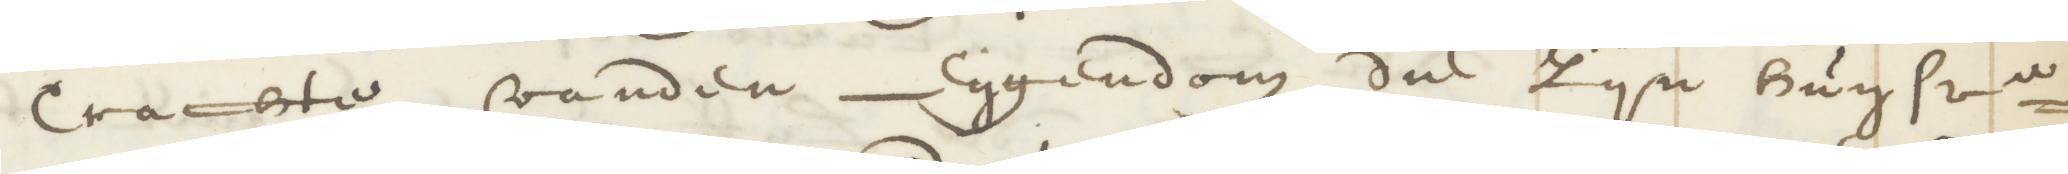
Crachte vanden Eijgendom die zijn huijsv=w
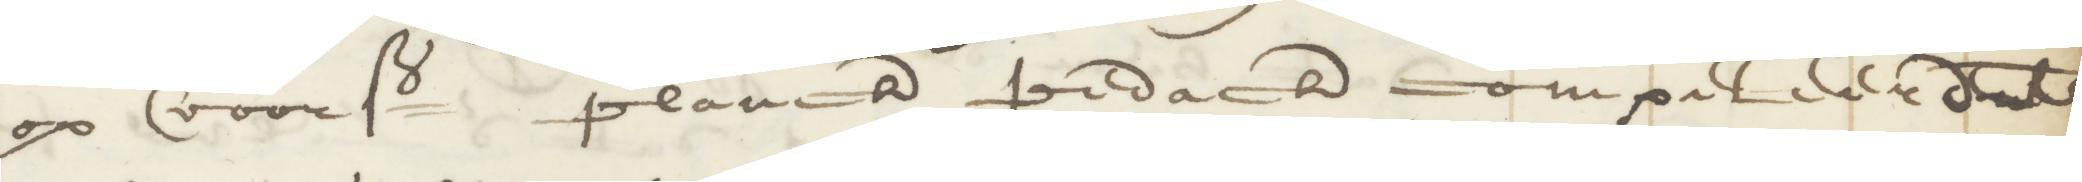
op voorsz planck pedack competeerde
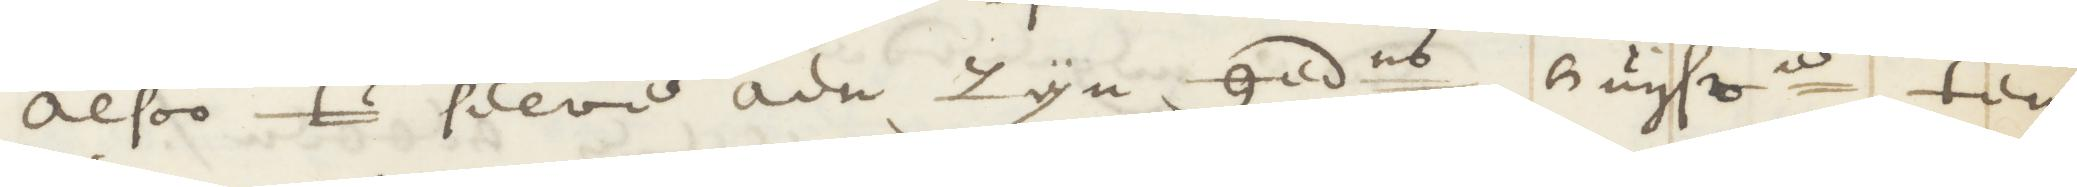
alsoo t' selve aen zijn ged=ns huijsv=w ten
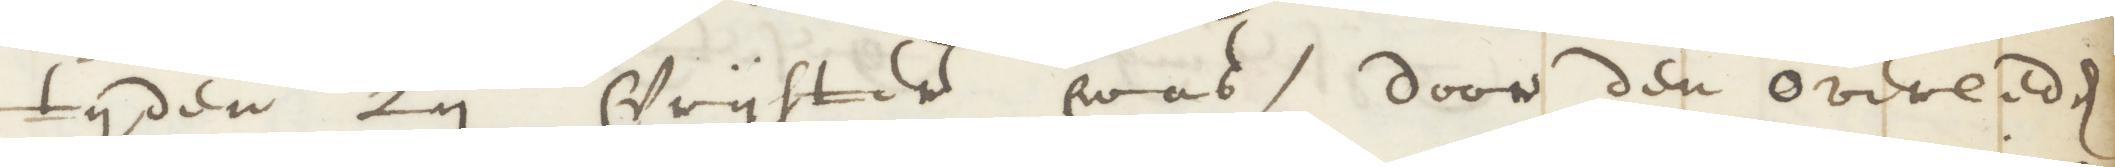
tijden zij Vrijster was, door den overleden
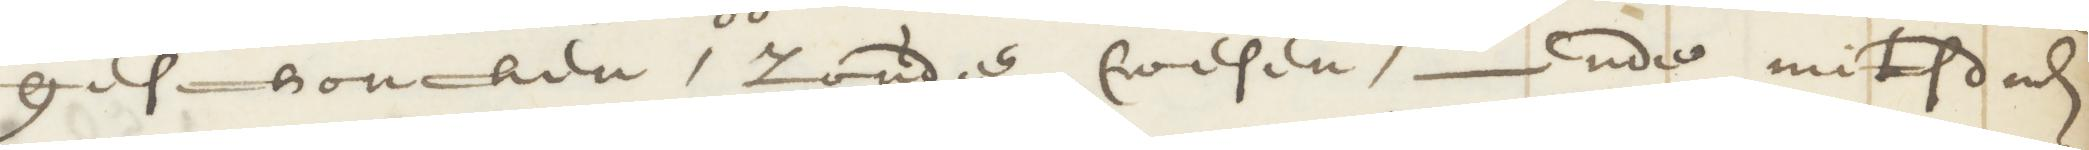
geschoncken, zoude wesen, ende mitsdien
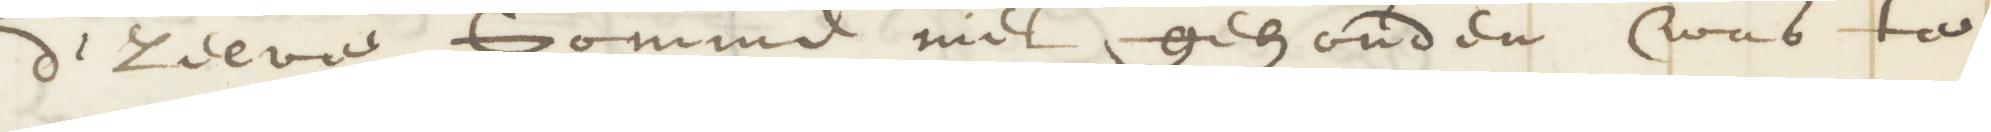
d’ zelve Somme niet gehouden was te
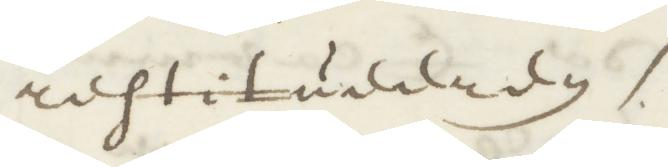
restitueeren/.
